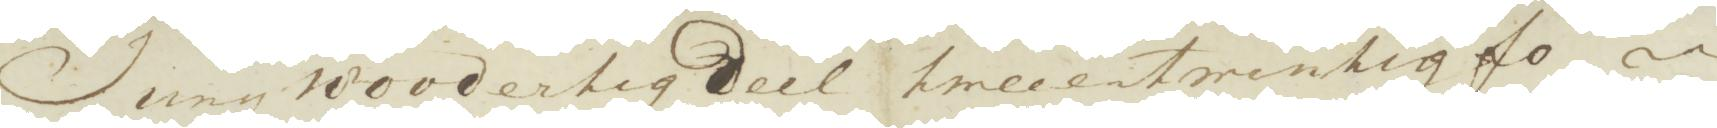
Iuny 1800dertig deel twee entwintig fo
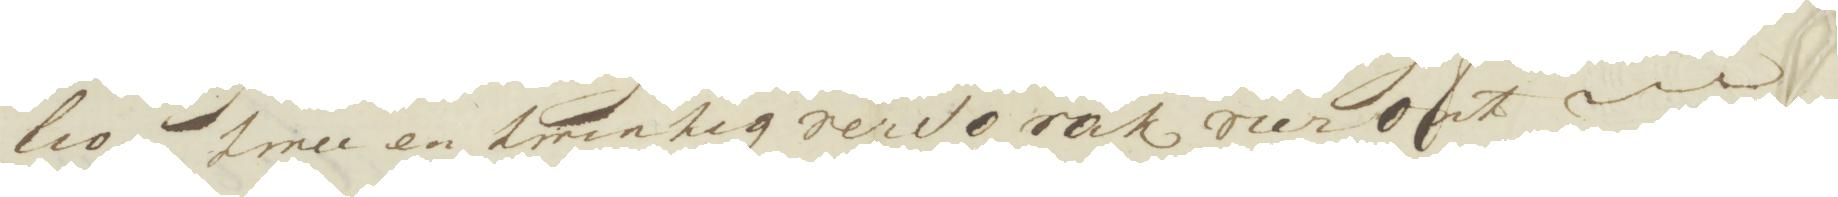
lio twee en twintig verso vak vier ont
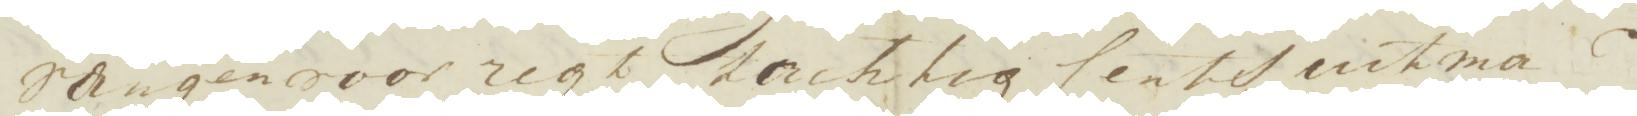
vangen voor regt tachtig Cents uitma
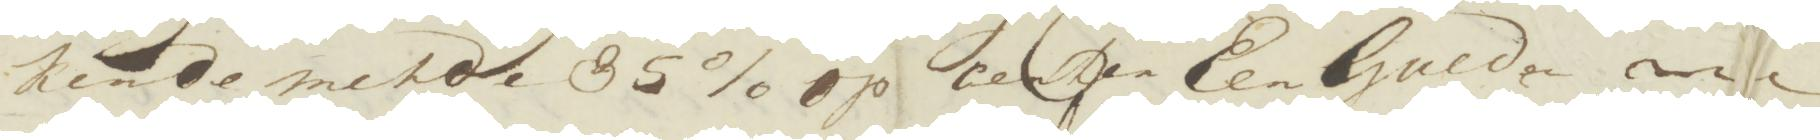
kende metde 35 % op centen Een Gulden
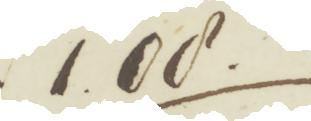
1.08.
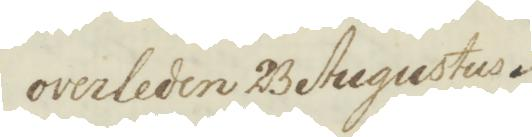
overleden 23 Augustus
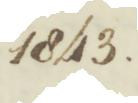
1843
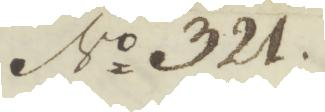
N=o 321.
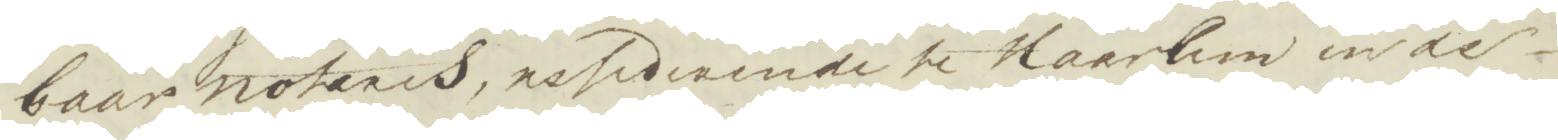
baar notaris, residerende te Haarlem in de
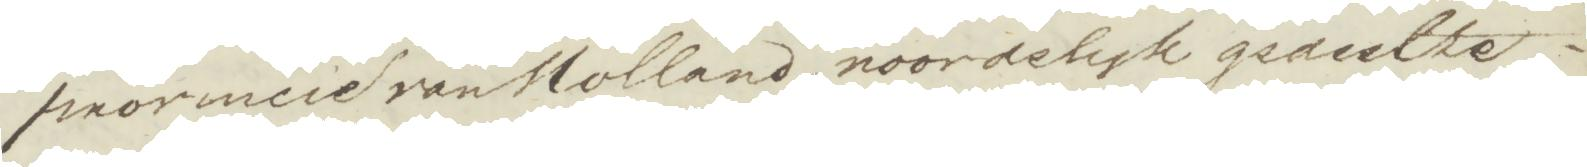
provincie van Holland, noordelyk gedeelte
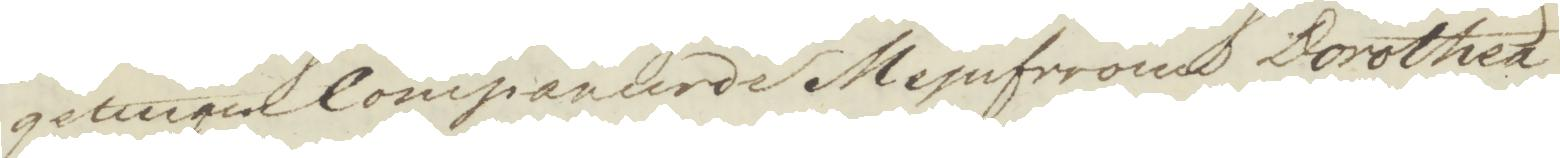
getuigen Compareerde Mejufvrouw Dorothea
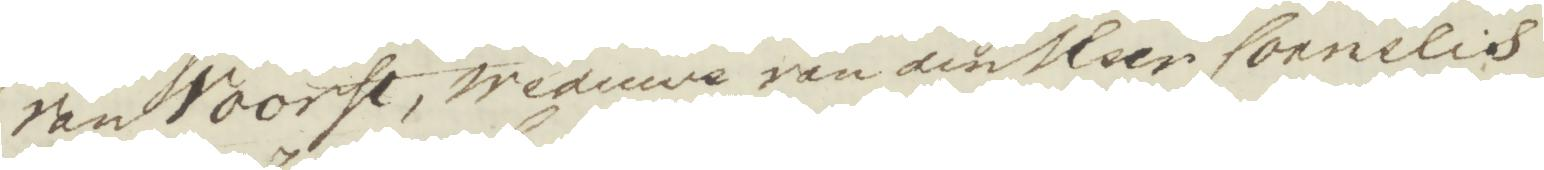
van Voorst, weduwe van den Heer Cornelis
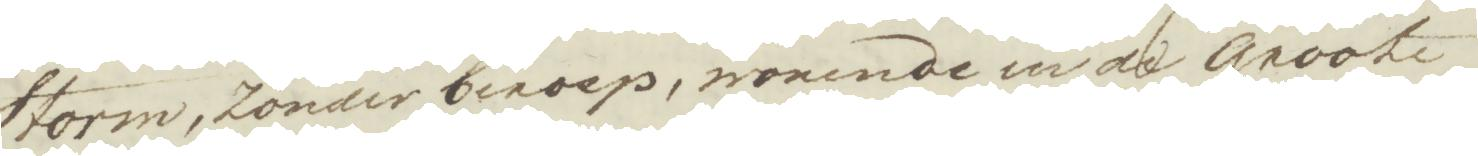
Storm, zonder beroep, wonende in de groote
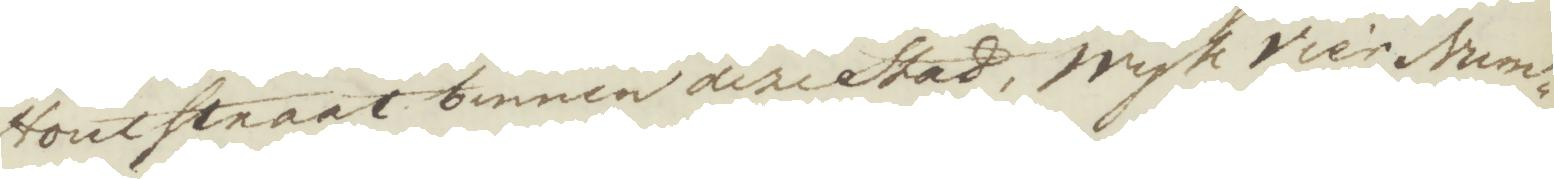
Houtstraat binnen deze stad, wijk Vier Num„
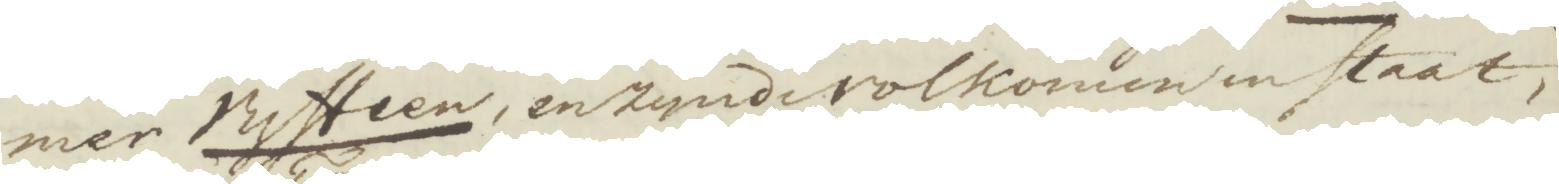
mer Vyftien, enzyndevolkomen in staat,
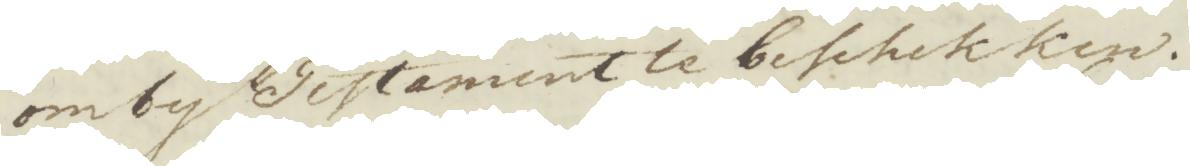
om by Testament te beschikken.
